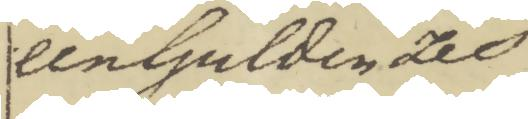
een Gulden zes
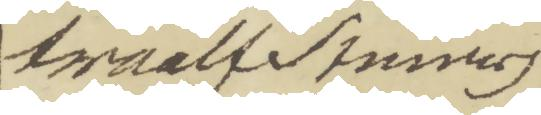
twaalf Stuivers
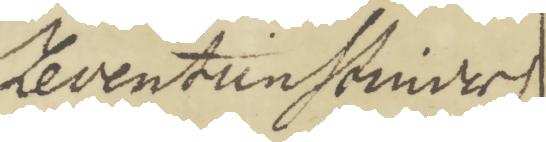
Zeventien stuivers
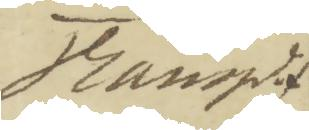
Transp.t ƒ
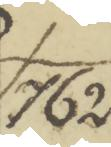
762
